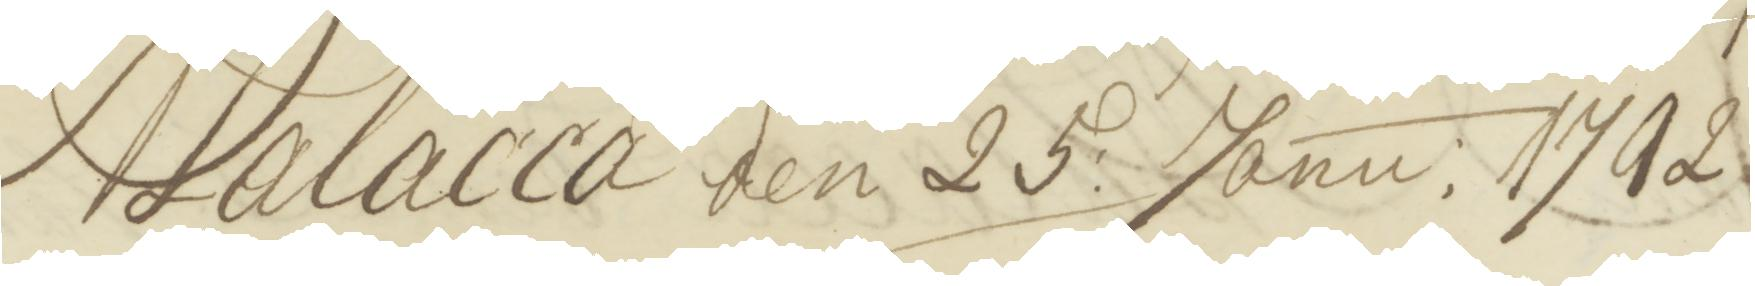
Van Malacca den 25:'e Janu: 1742
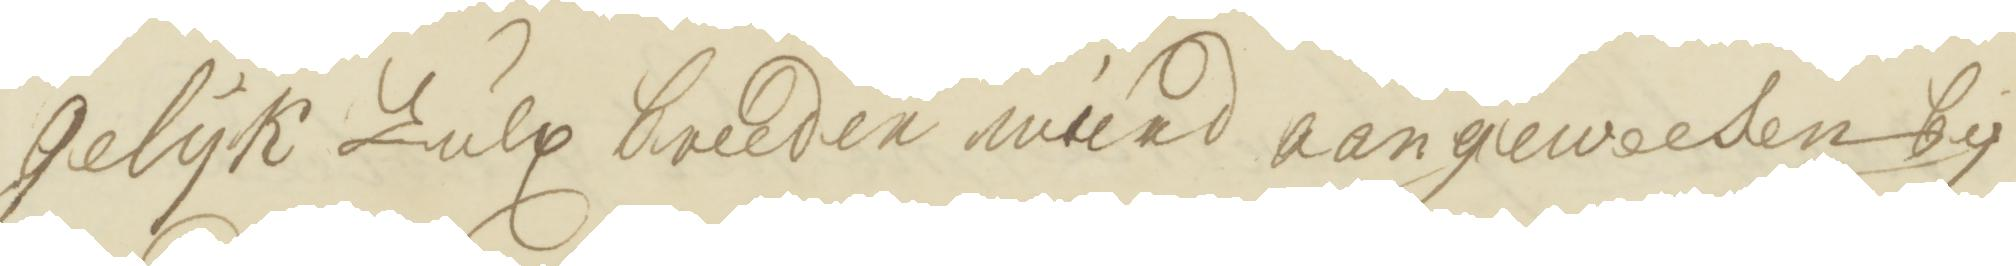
gelijk zulx breeder wierd aangeweesen bij
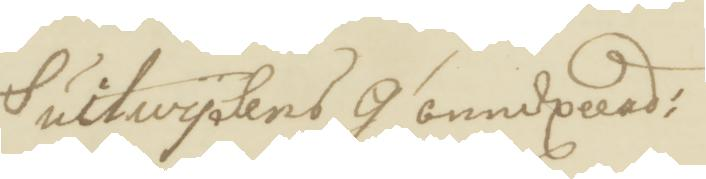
uitwijsens g'annexeerd:
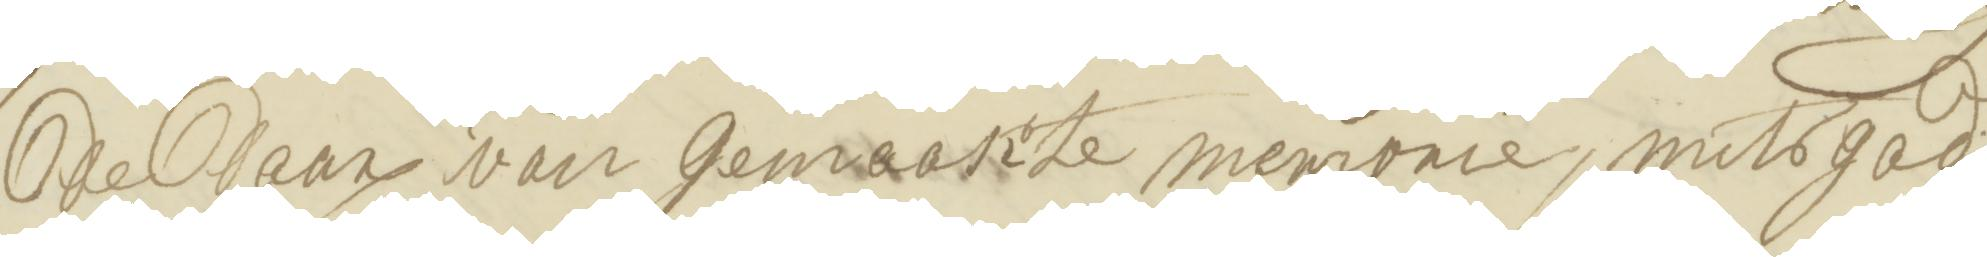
de daar van gemaakte memorie, mitsgad:s
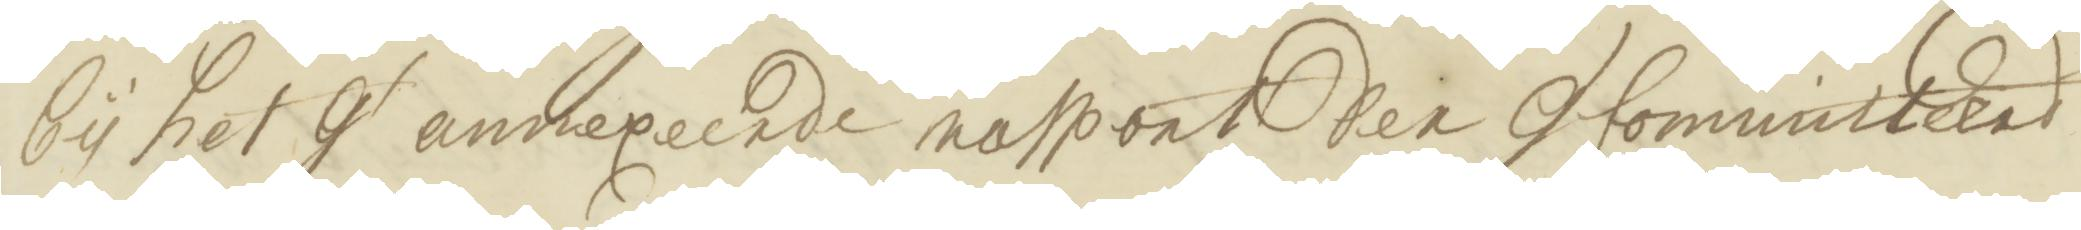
bij het g'annexeerde rapport der g'committeerd
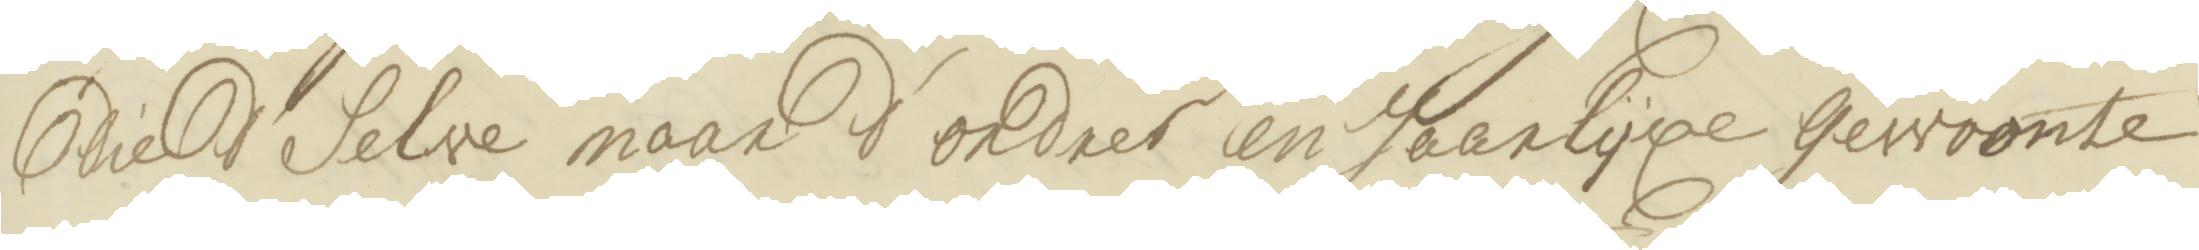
die d'Selve naar d’ordres en Jaarlijxe gewoonte
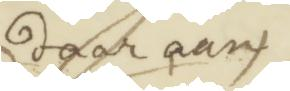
daar aan
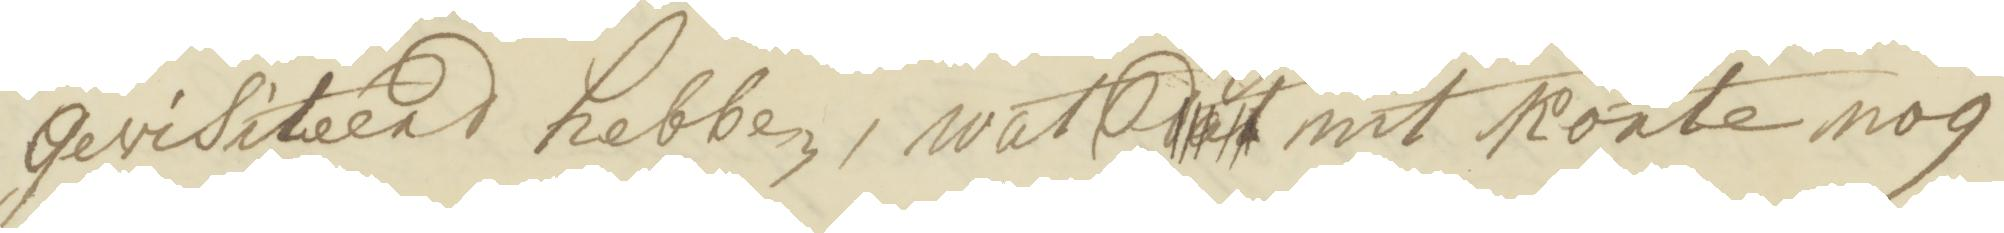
gevisiteerd hebben, wat dat in't korte nog
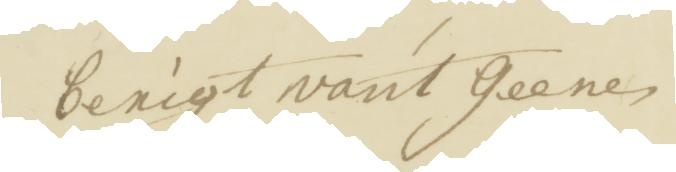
berigt van’t Geene
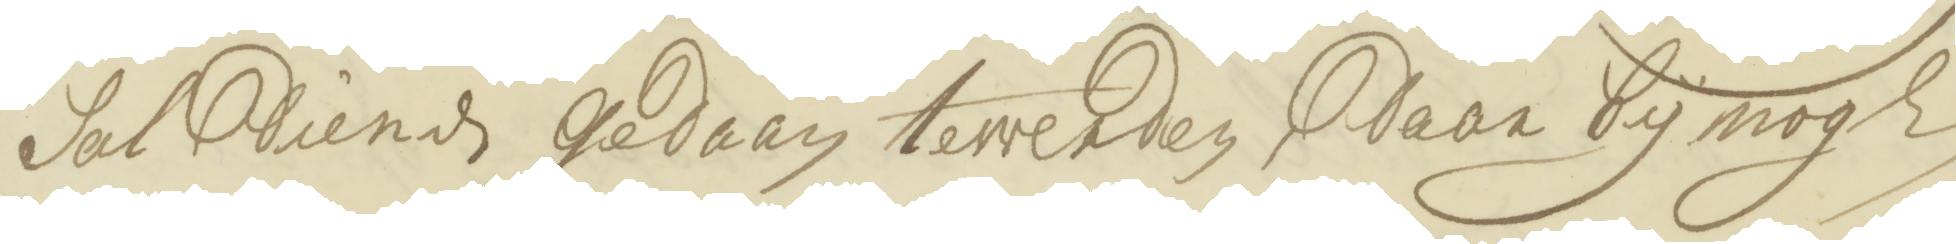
Sal dienen gedaan te werden, daar bij nogh
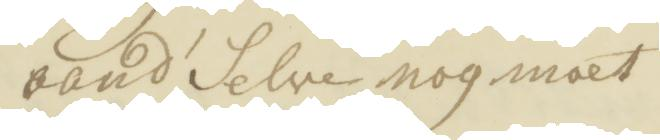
aan d’ Selve nog moet
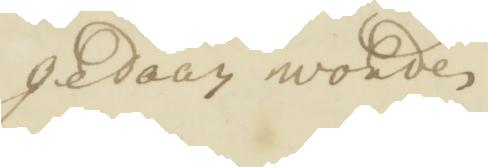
gedaan worden
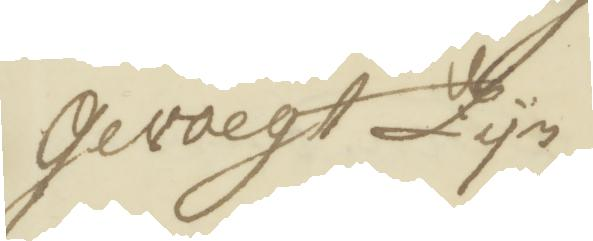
gevoegt Zijn
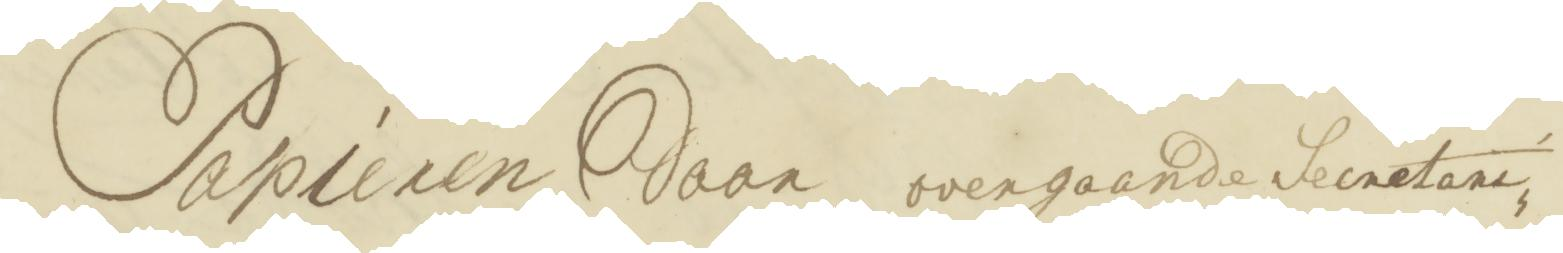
Papieren daar overgaande Secretari„
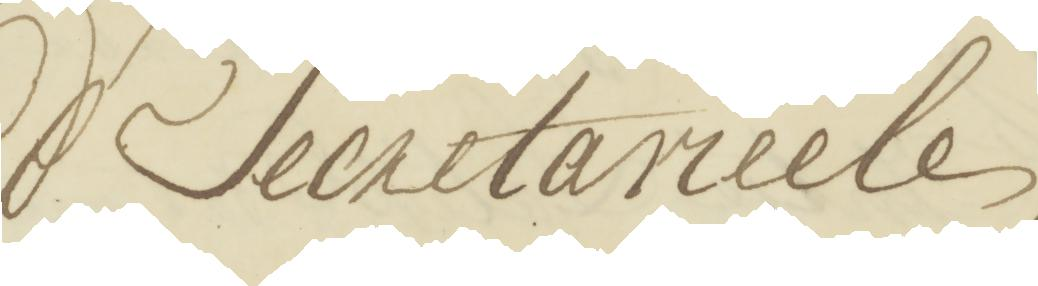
d’ Secretarieele
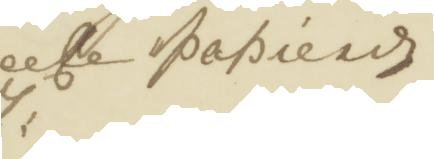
eele papieren
